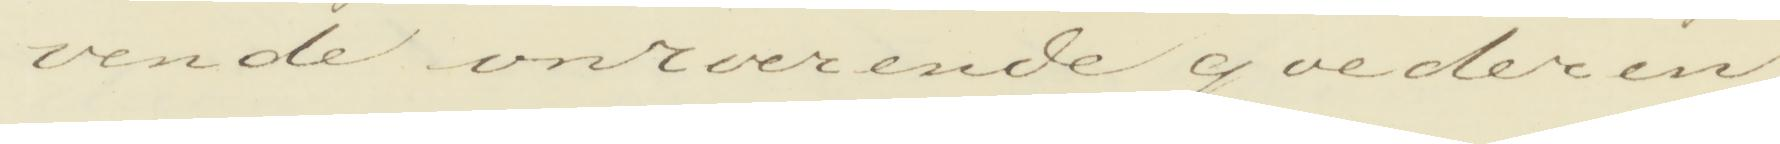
vende onroerende goederen
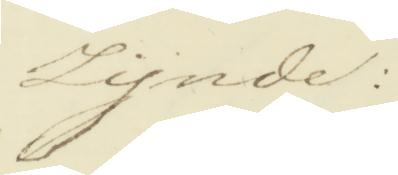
zijnde:
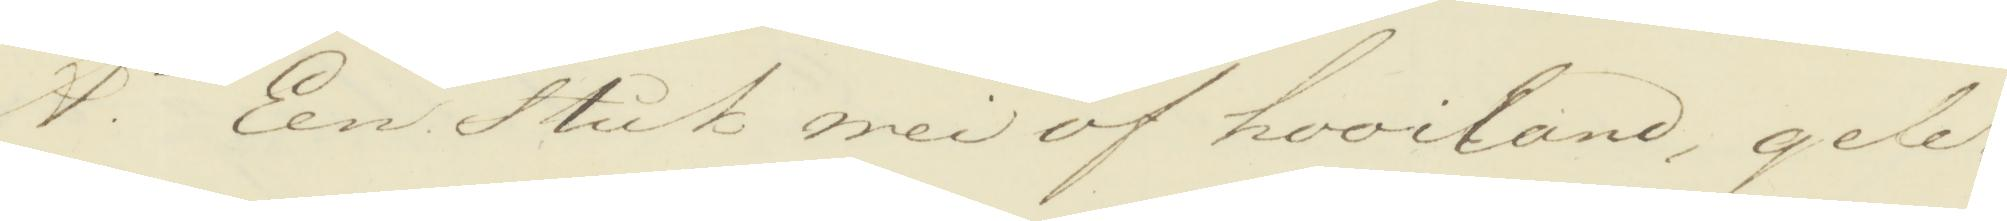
A. Een stuk wei of hooiland, gele„
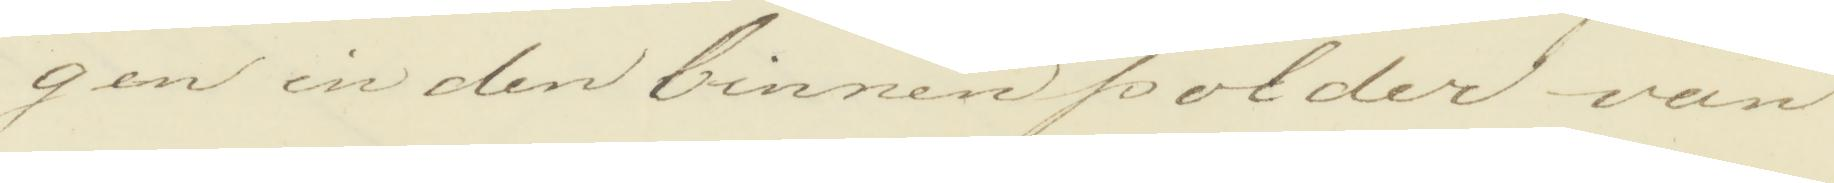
gen in den binnen polder van
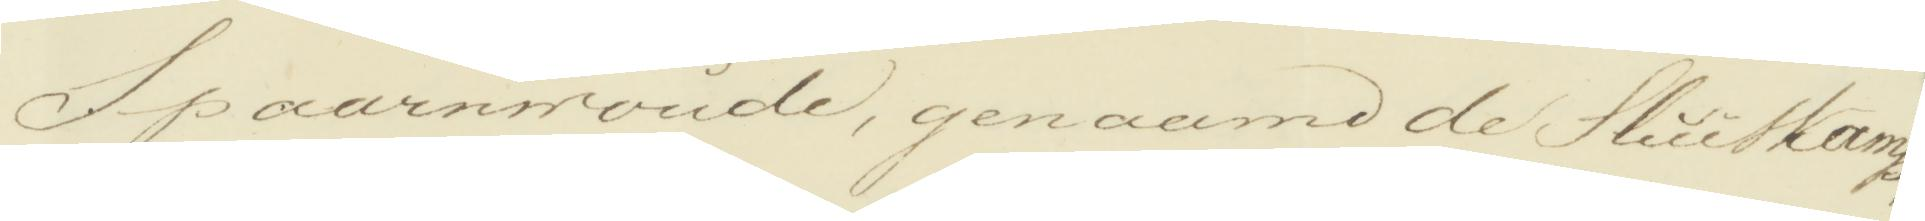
Spaarnwoude, genaamd de Sluitkamp
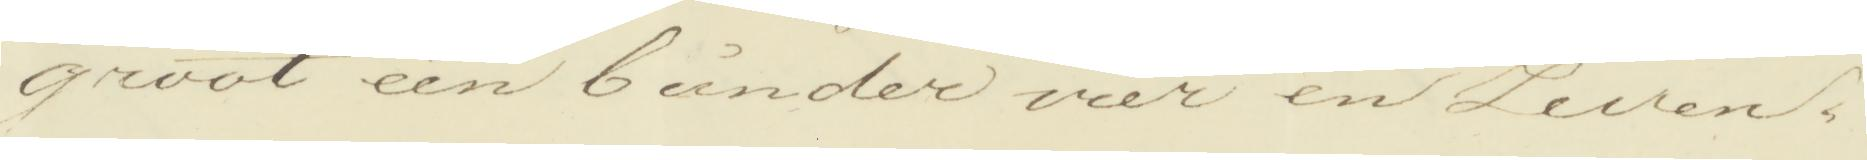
groot één bunder vier en Zeven„
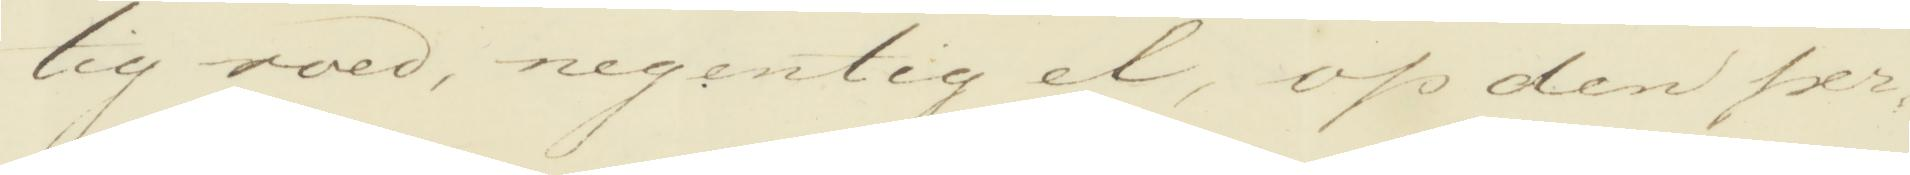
tig roed, negentig el, op den per
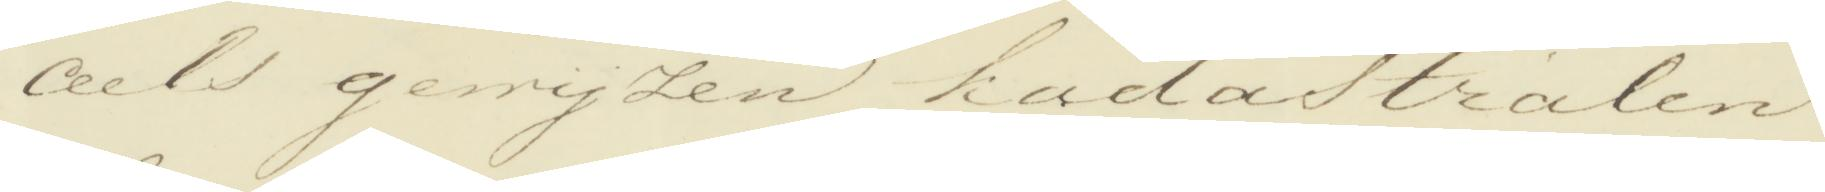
ceels gewijzen kadastralen
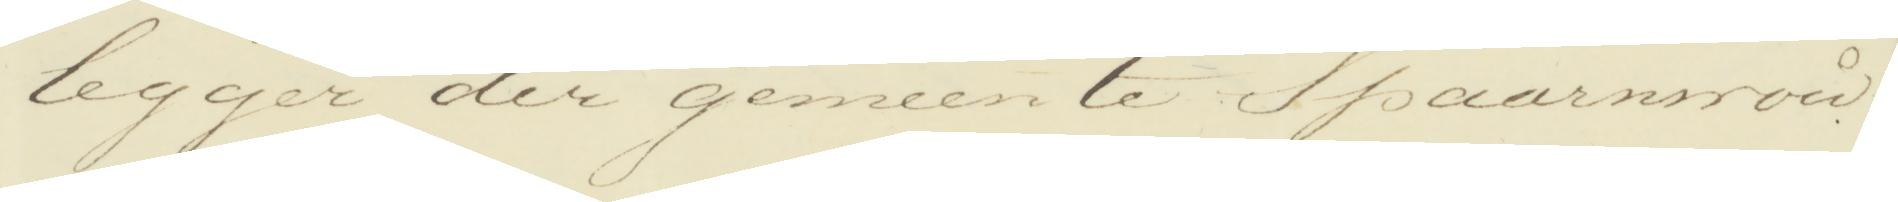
legger der gemeente Spaarnwou„
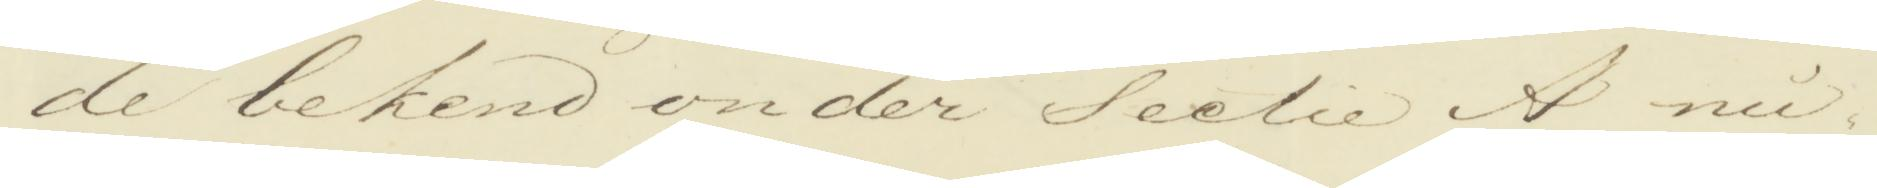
de bekend onder sectie A nu„
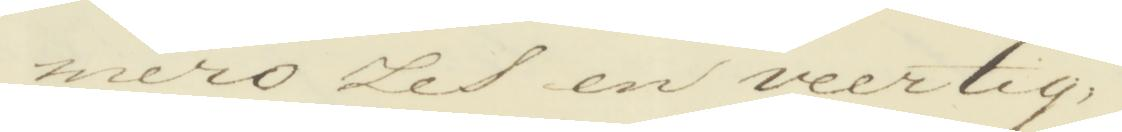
mero zes en veertig;
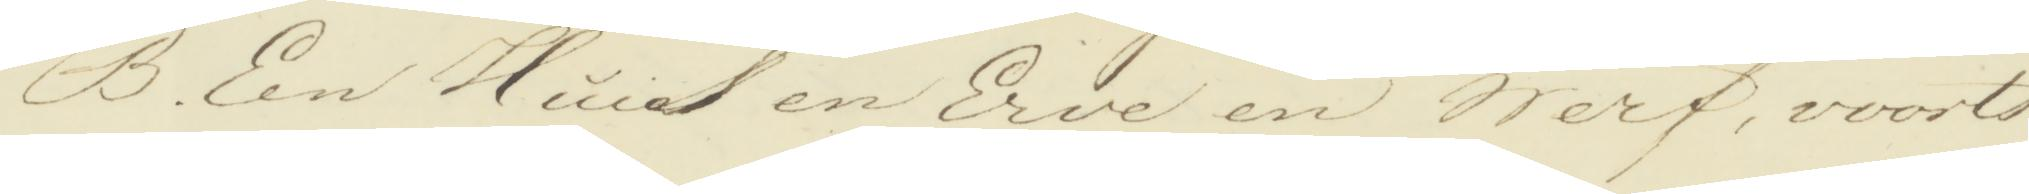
B. Een Huis en Erve en Werf, voorts
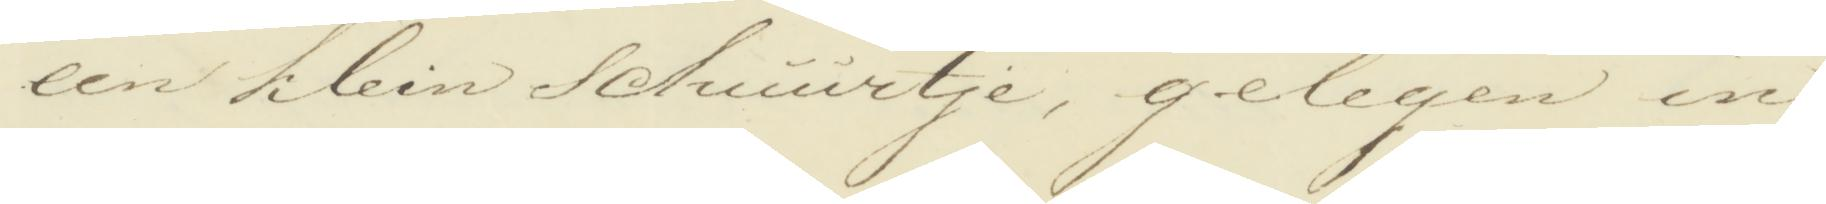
een klein schuurtje, gelegen in
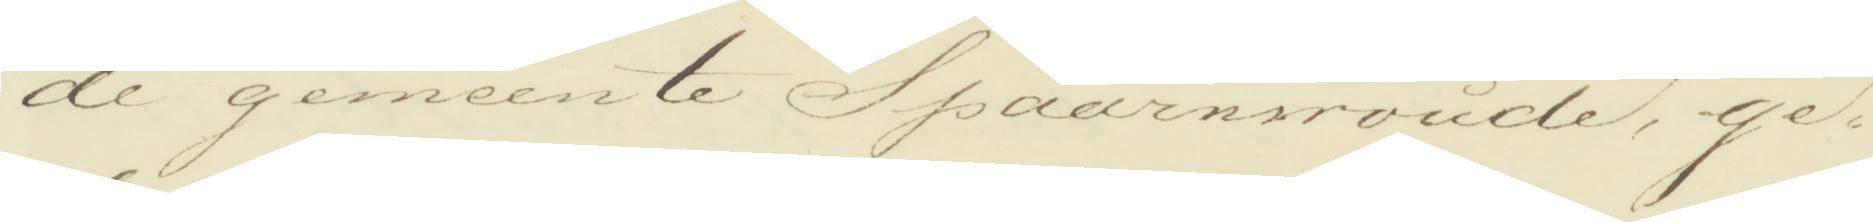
de gemeente Spaarnwoude, ge„
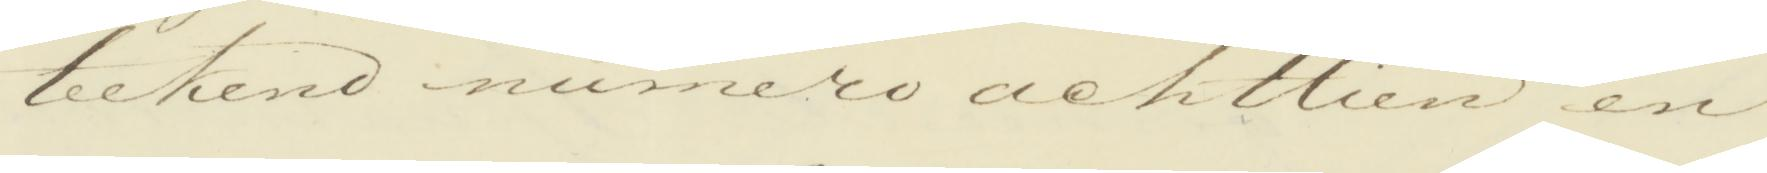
teekend numero achttien en
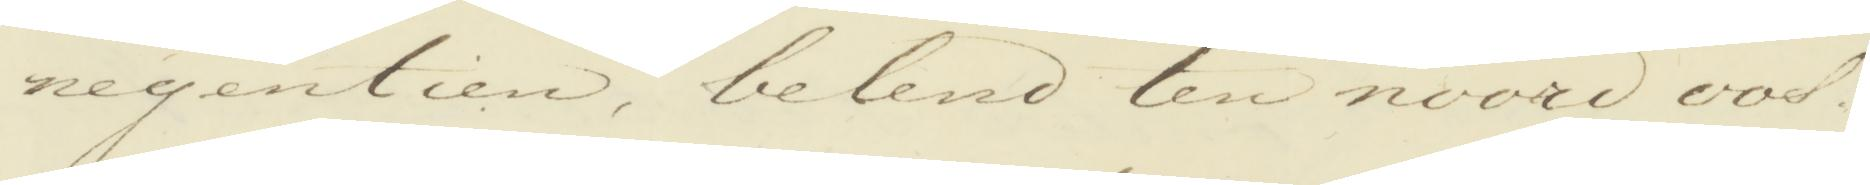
negentien, belend ten noord oos„
